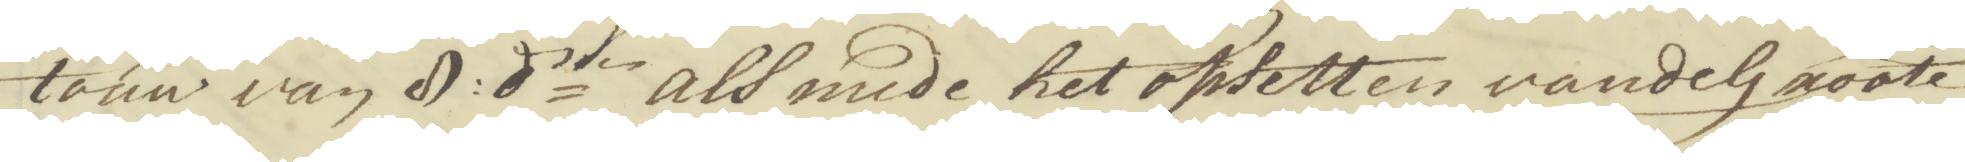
touw van 8: d=m als mede het opsetten van de groote
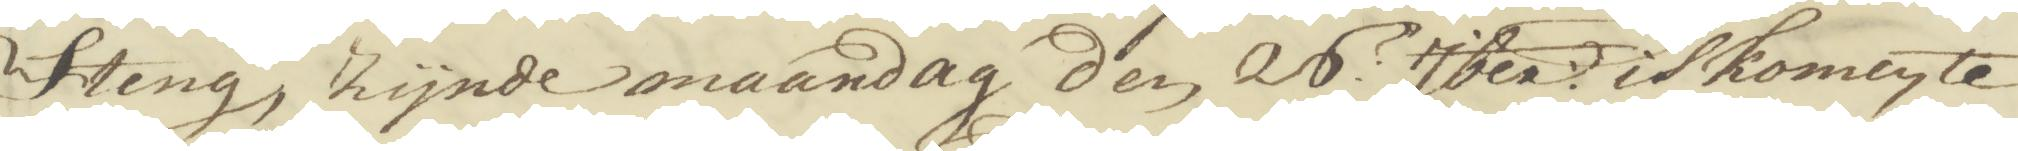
steng, zijnde maandag den 26:' 7ber: is komen te
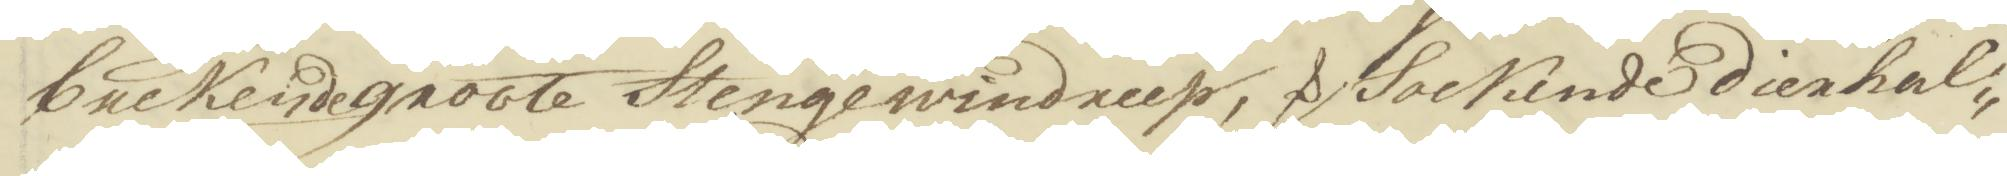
breken de groote stengewindreep, versoekende dierhal„
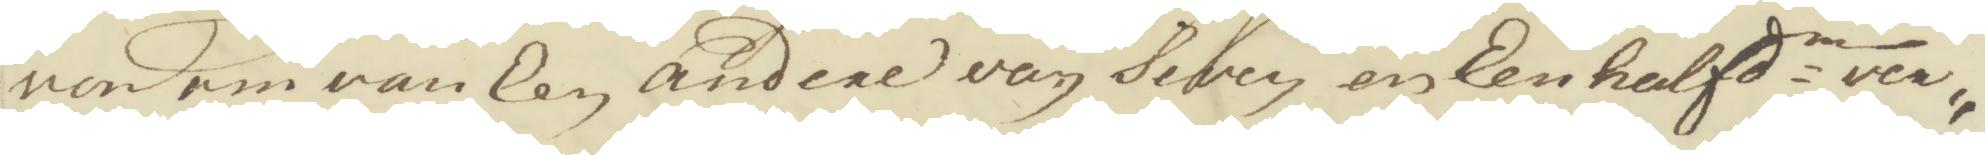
ven om van Een andere van seven en Een half d=m ver„
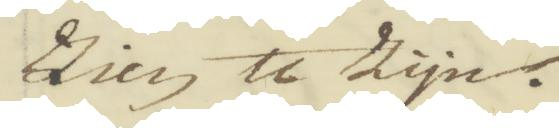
zien te zijn.
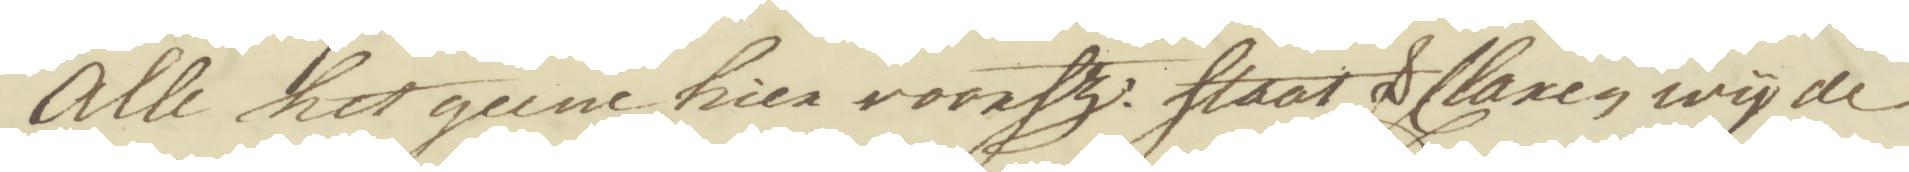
Alle het geene hier voorsz: staat verclaren wij de
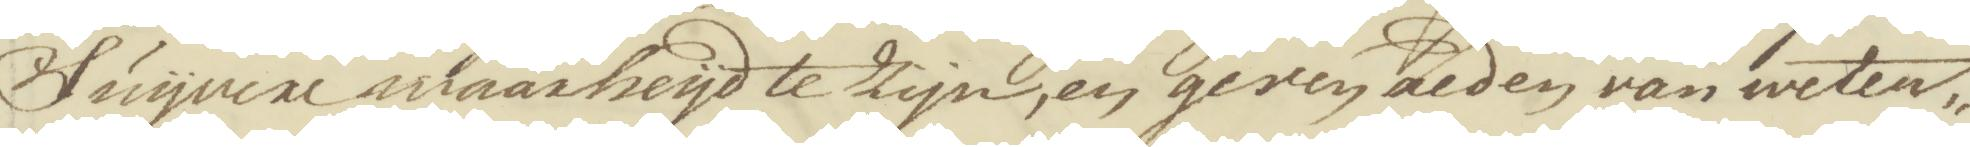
Suijvere waarheijd te zijn, en geven aeden van weten„
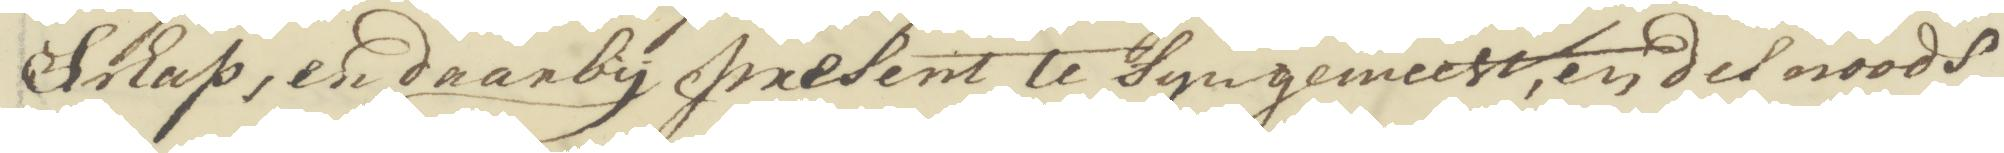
schap, en daarbij present te sijn gemeest, en des noods
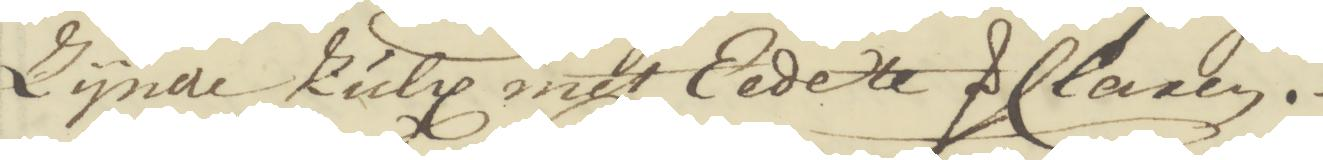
zijnde zulx met Eede te verclaren.
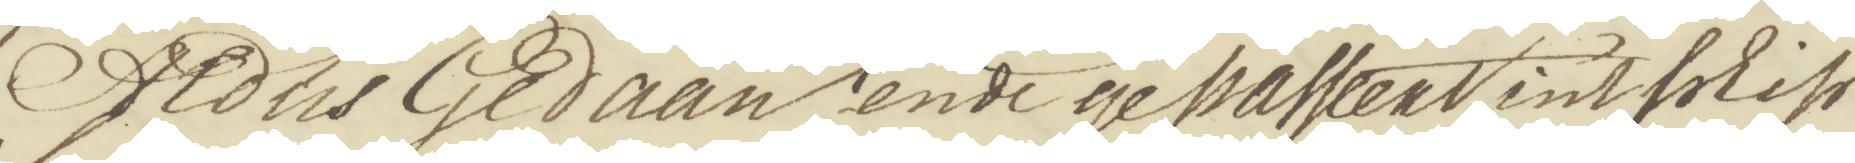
Aldus Gedaan ende gepasseert in’t schip
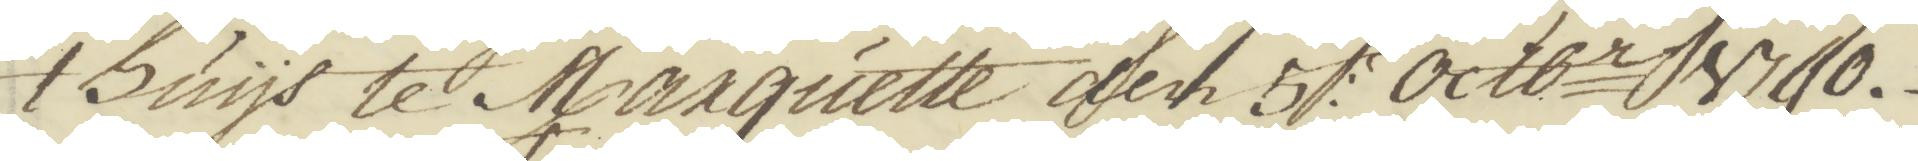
'thuijs te Marquette den 5:' Octb=r 1740.
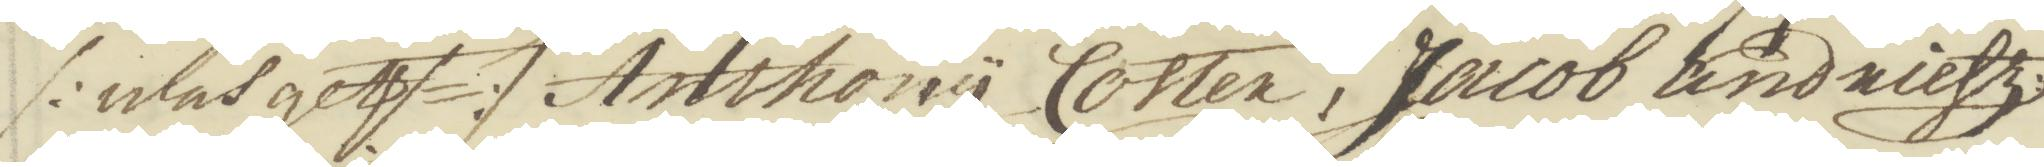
/:was get=t:/ Anthonij Coster, Jacob Andriesz
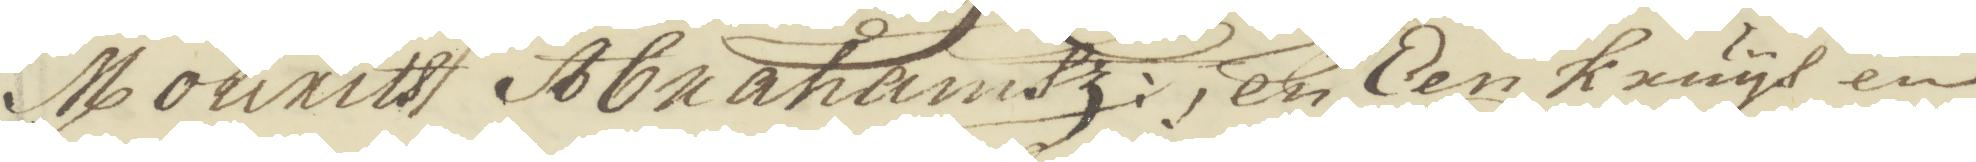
Mourits Abrahamsz:, en Een kruijs en
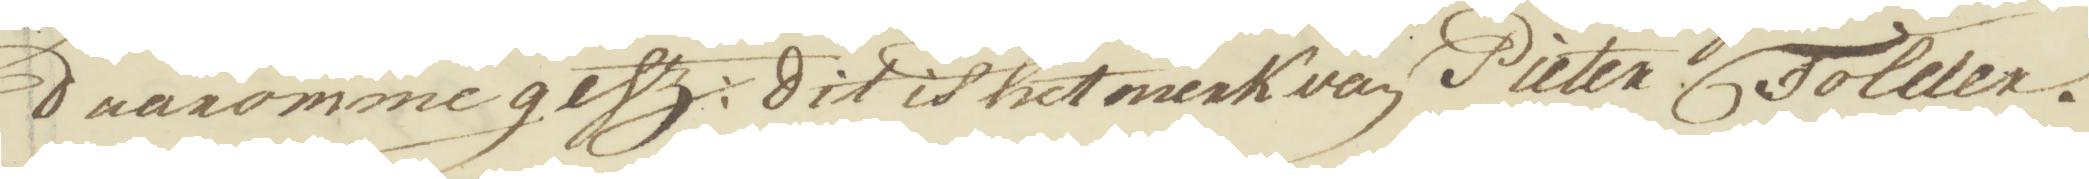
daaromme gesz: dit is het merk van Pieter Tolder.
